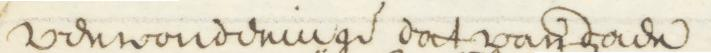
verwonderinge dat van daer
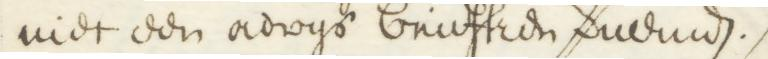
niet een advijs briefken vernemen./
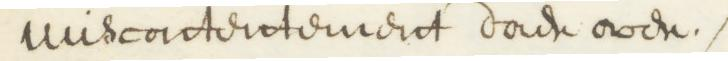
miscontentement daer over./
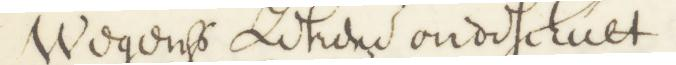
Wegens zekere oudeschult
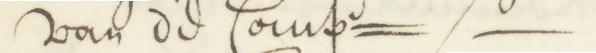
van de Comp=s /—
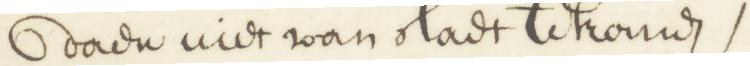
daer niet van staet tekomen /
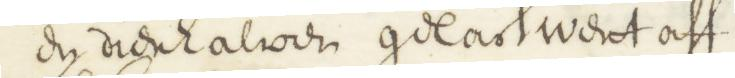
en dierhalven gelast wert aff
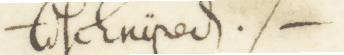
teschrijven./—
